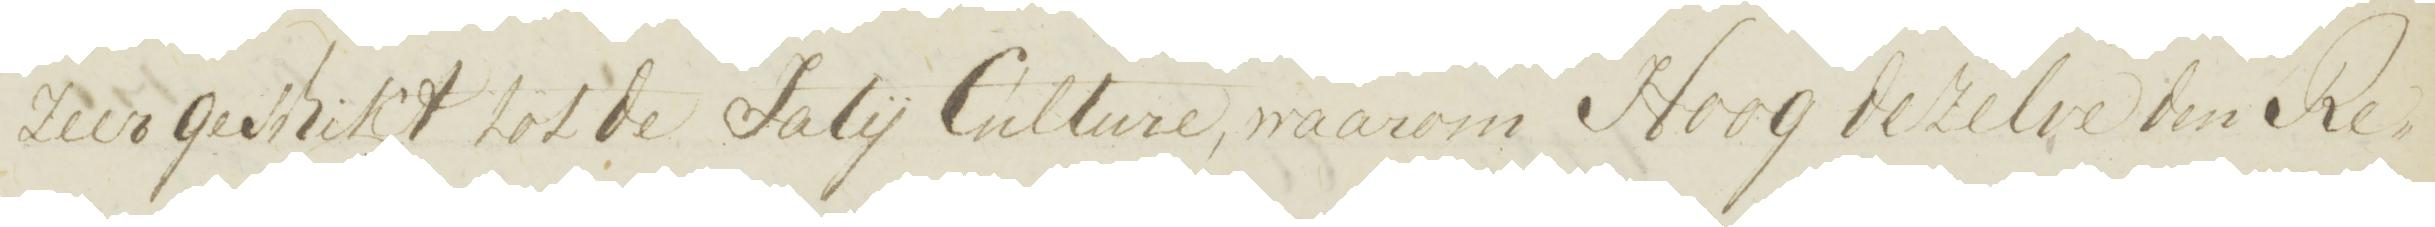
zeer geschikt tot de Iatij Culture, waarom Hoog dezelve den Re„
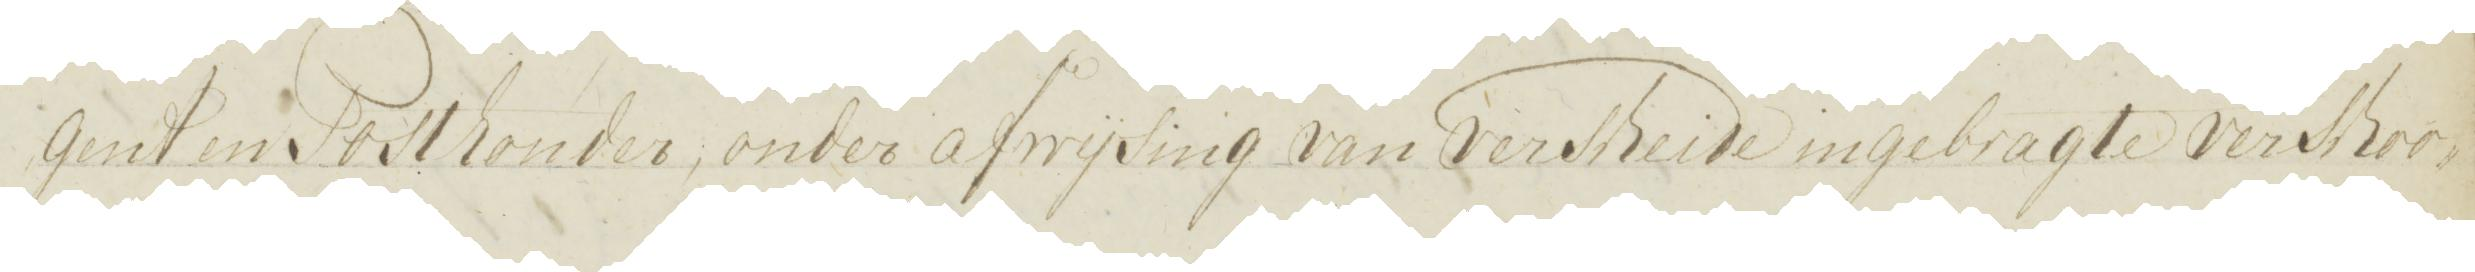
,gent en Posthouder, onder afwijsing van verscheide ingebragte verschoo„
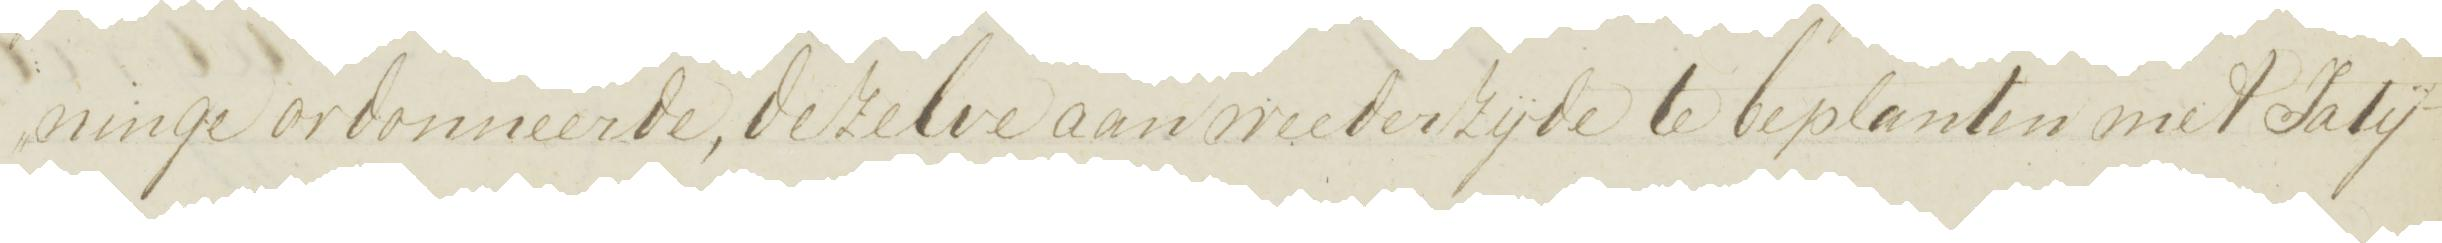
„ninge ordonneerde, dezelve aan weeder zijde te beplanten met Iatij
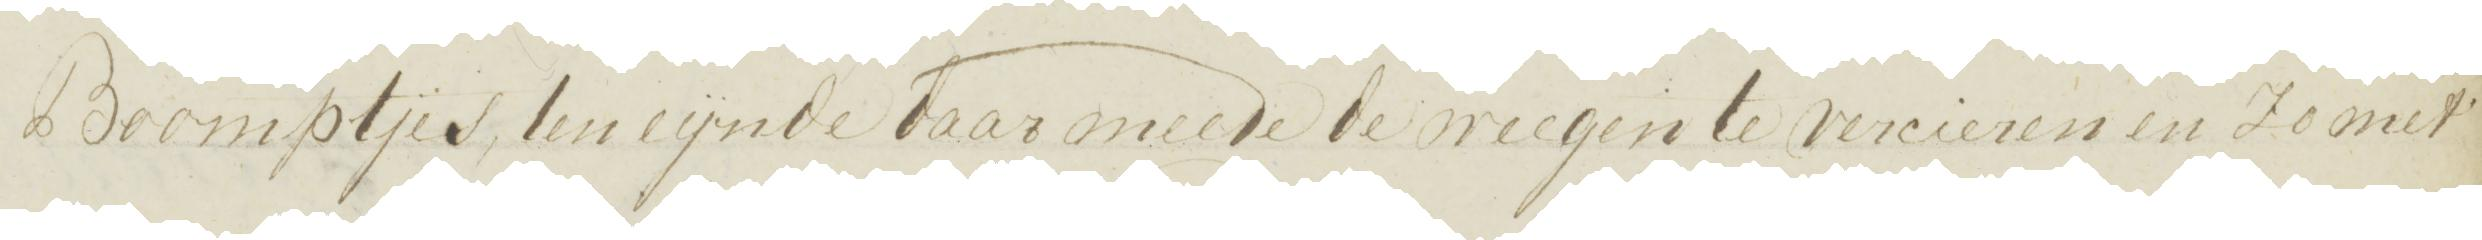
Boomptjes, ten eijnde daar meede de weegen te vercieren en zo met
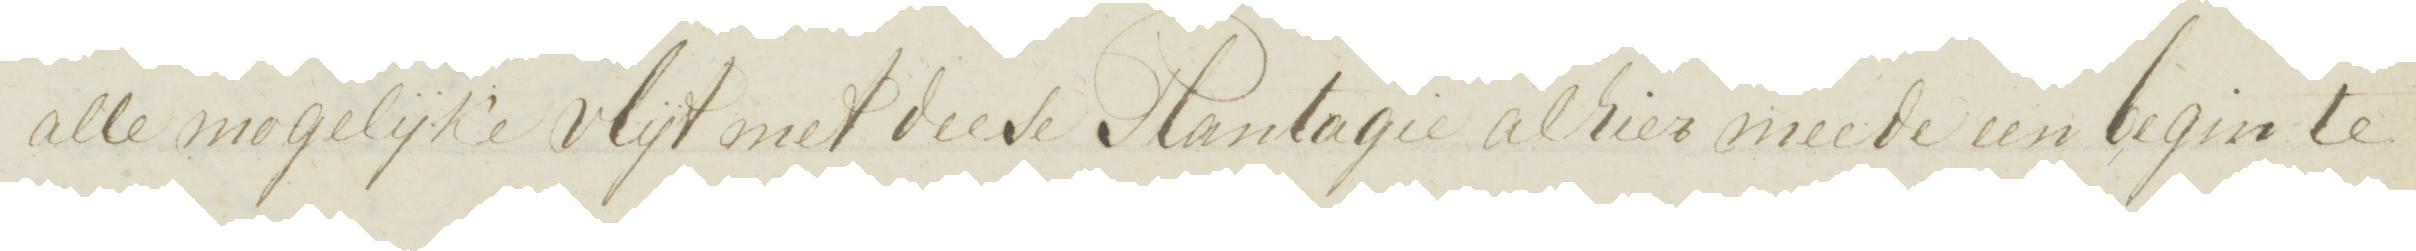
alle mogelijke vlijt met deese Plantagie alhier meede een begin te
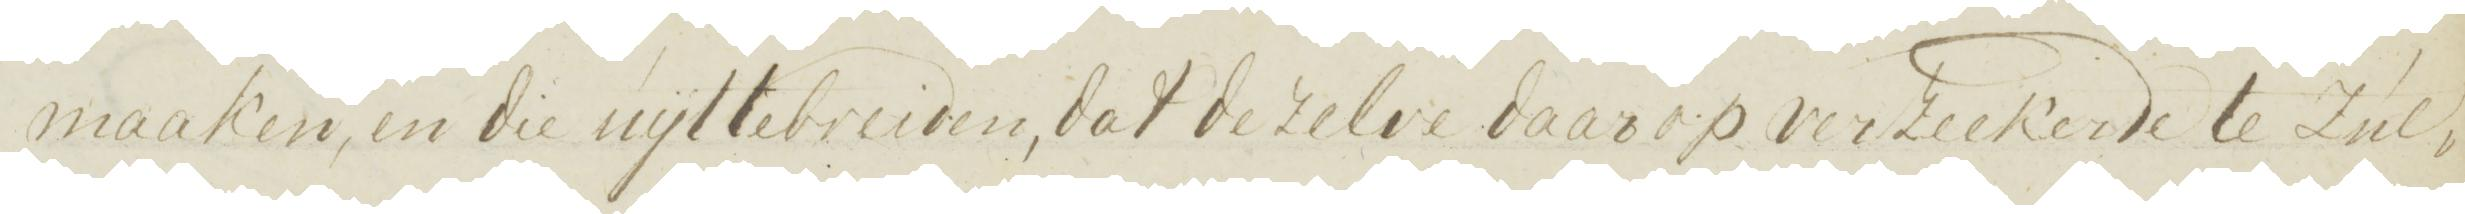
maaken, en die uijt te breiden, dat dezelve daar op verzeekerde te zul„
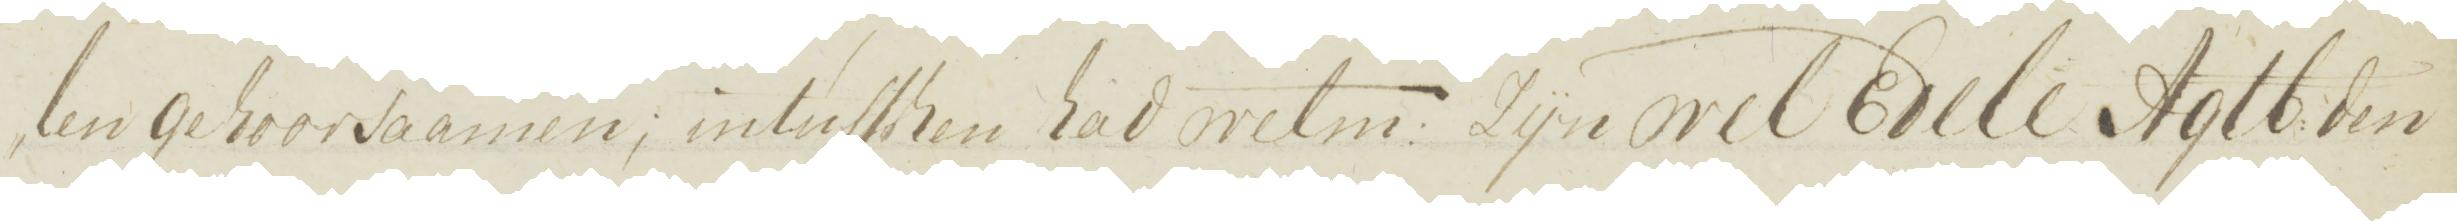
„len gehoorsaamen; intusschen had welm: zijn wel Edele Agtb: den
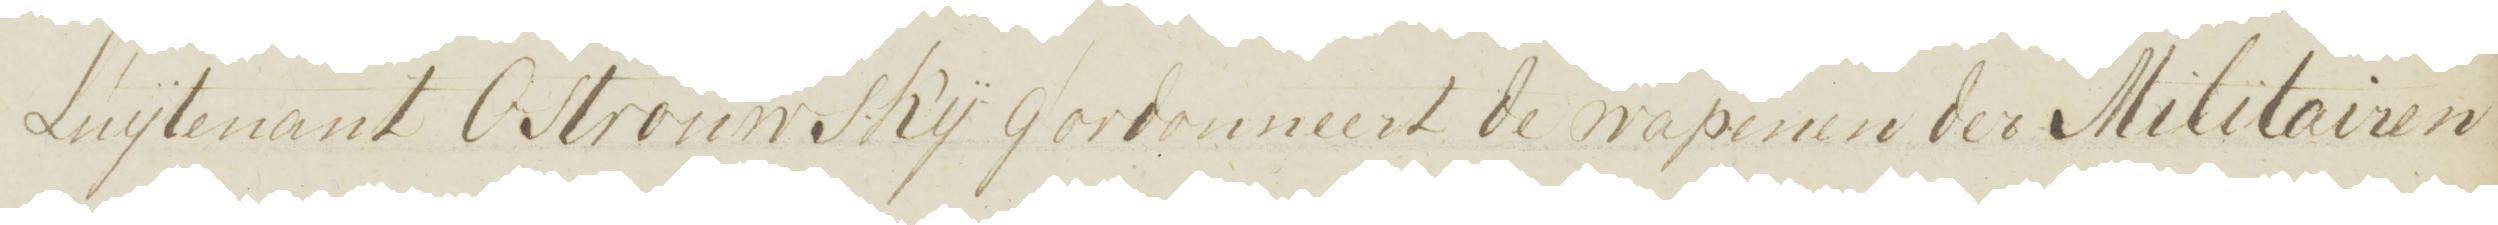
Luijtenant Ostrouwskij g'ordonneert de wapenen der Militairen
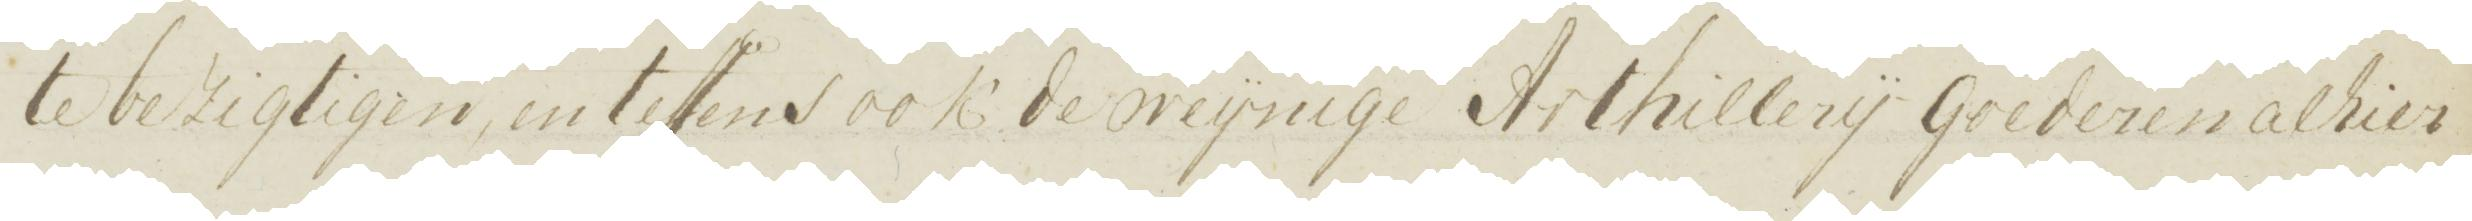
te bezigtigen, en teffens ook de weijnige Arthillerij Goederen alhier
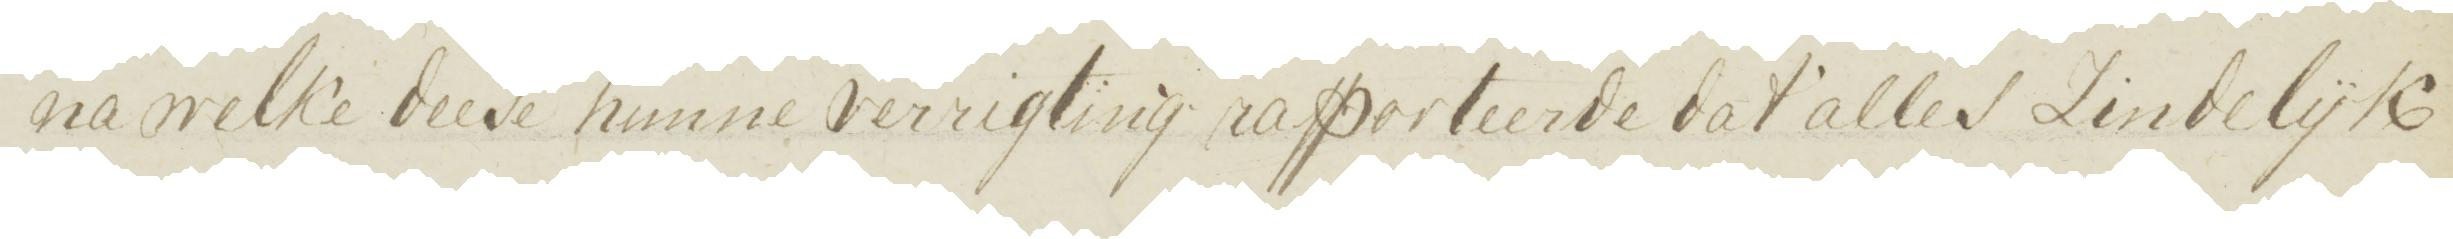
na welke deese hunne verrigting rapporteerde dat alles zindelijk
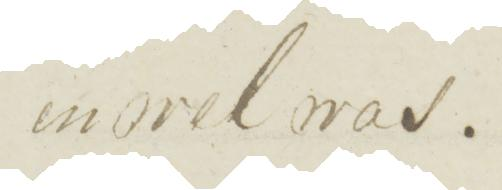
en wel was.
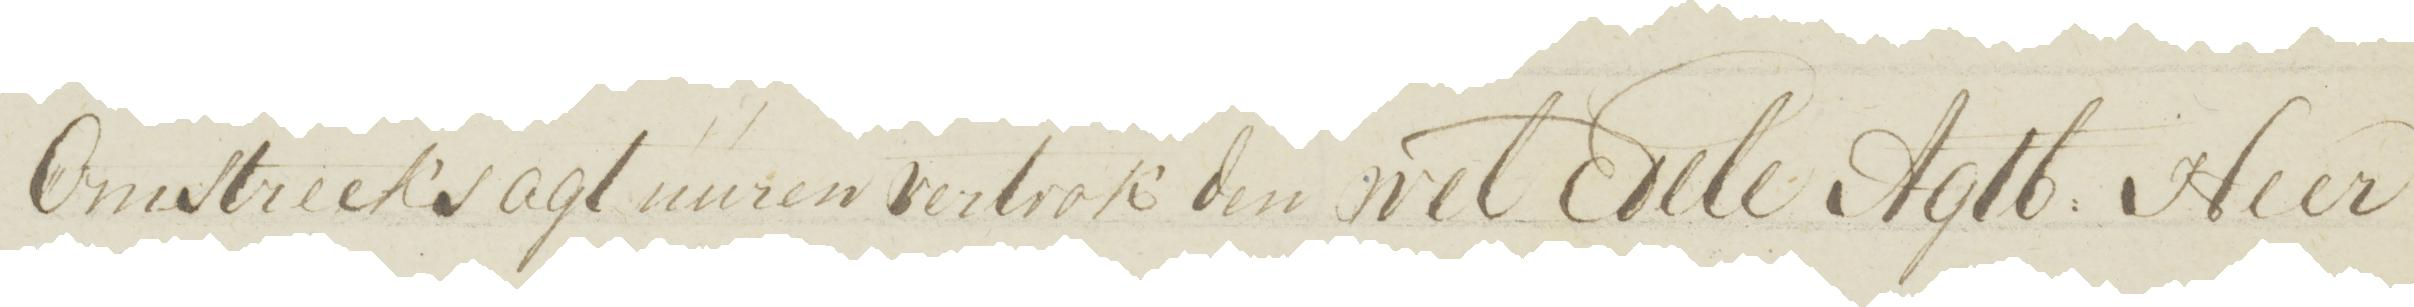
Omstreeks agt uuren vertrok den wel Edele Agtb: Heer
